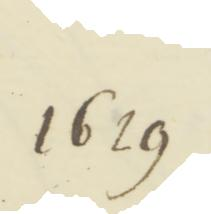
1629
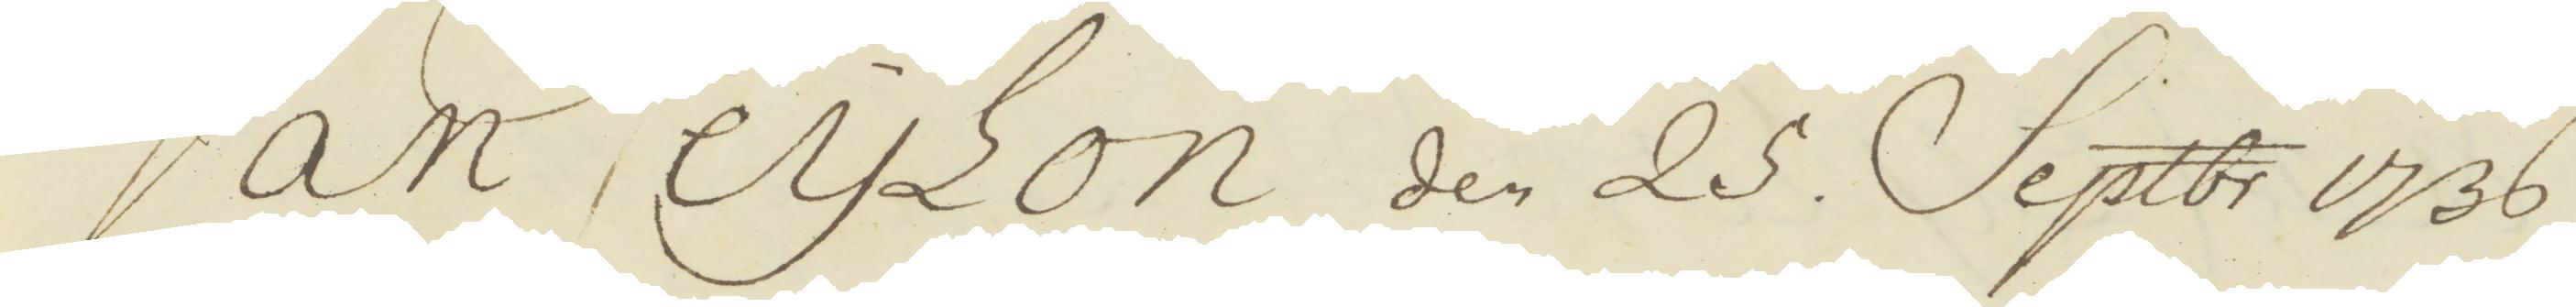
Van Ceijlon den 25. Septbr 1736
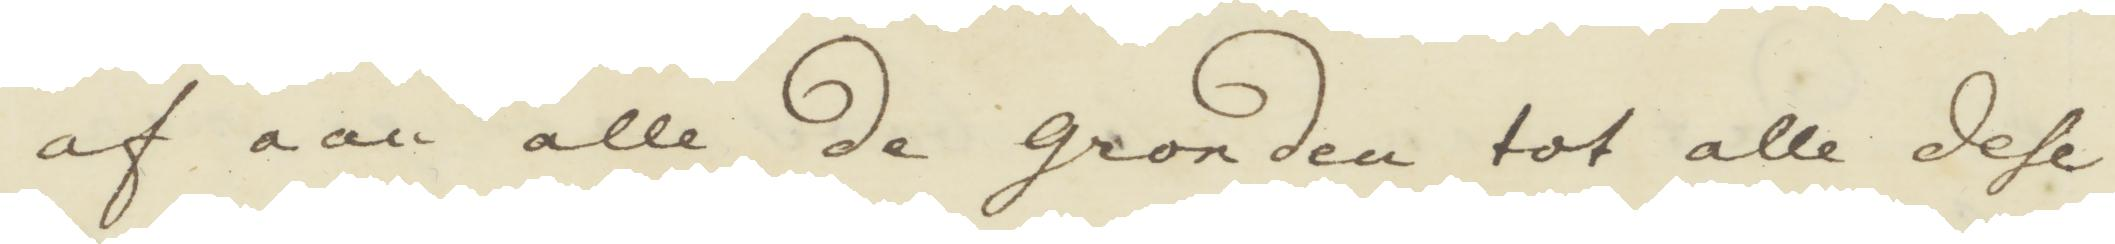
af aan alle de gronden tot alle dese
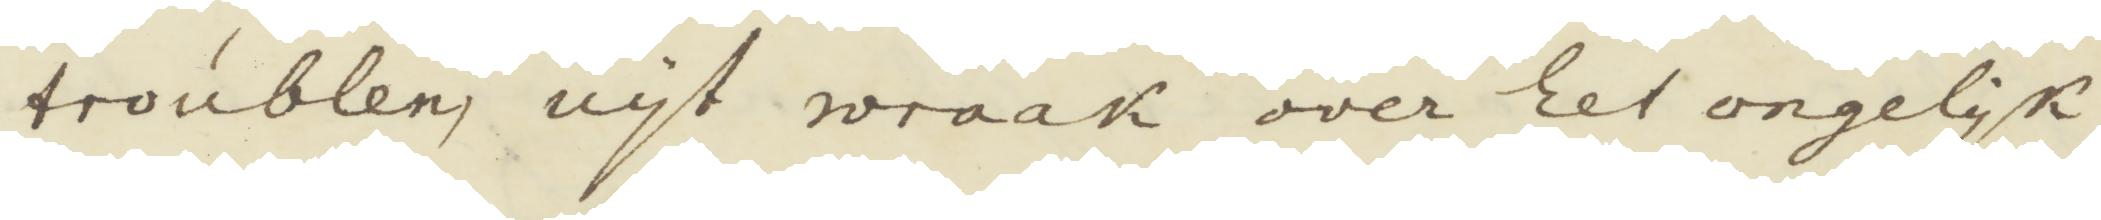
troublen, uijt wraak over het ongelijk
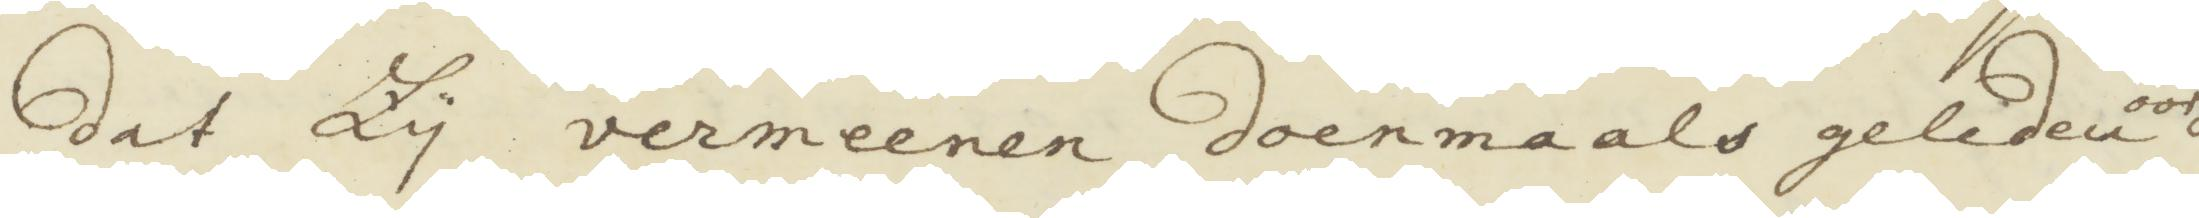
dat zij vermeenen doenmaals geleden
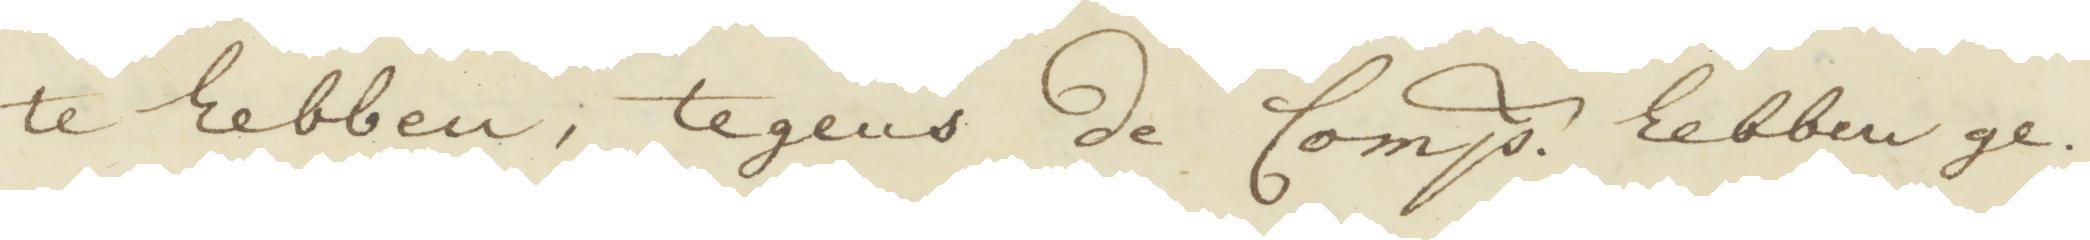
te hebben; tegens de Comp. hebben ge.
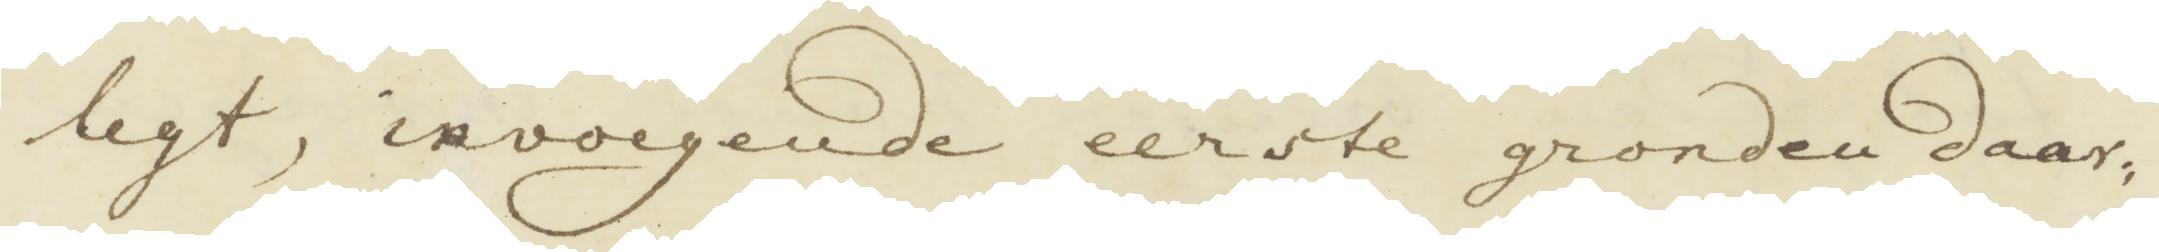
legt, invoegende eerste gronden daar„
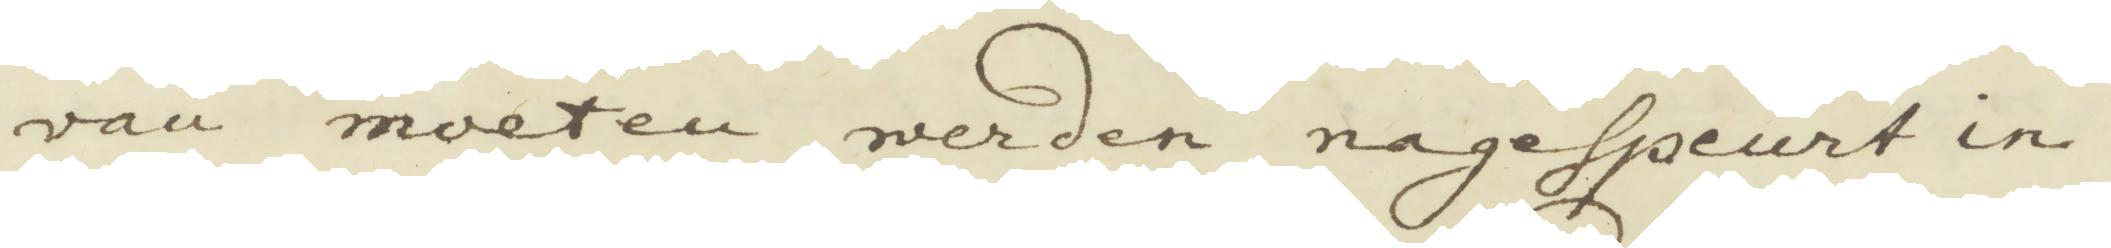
van moeten werden nagespeurt in
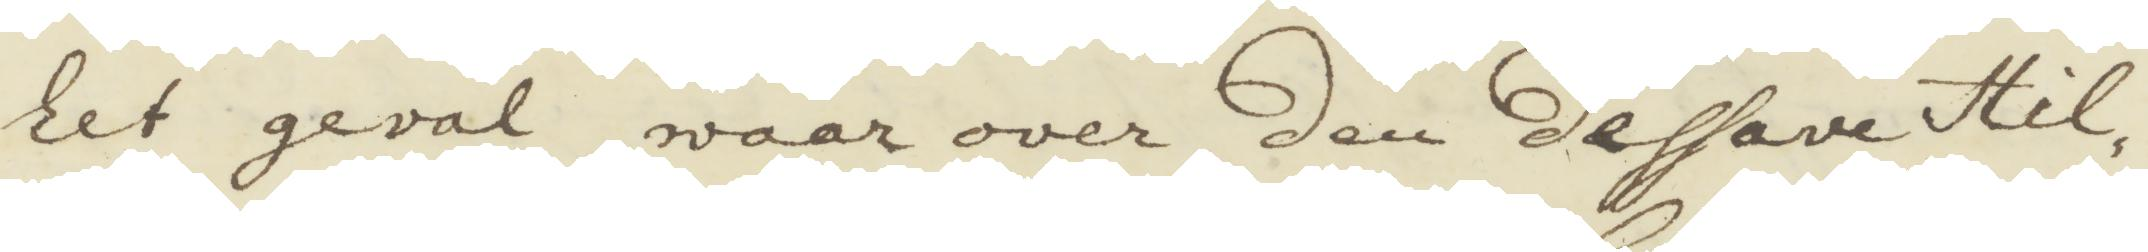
het geval waar over den dessave Hil„
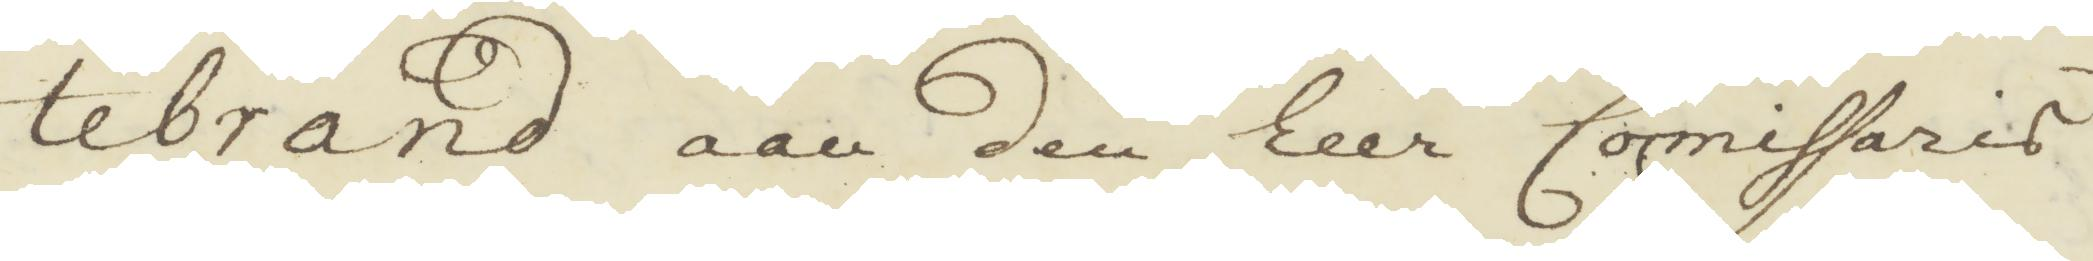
tebrand aan den heer Comissaris
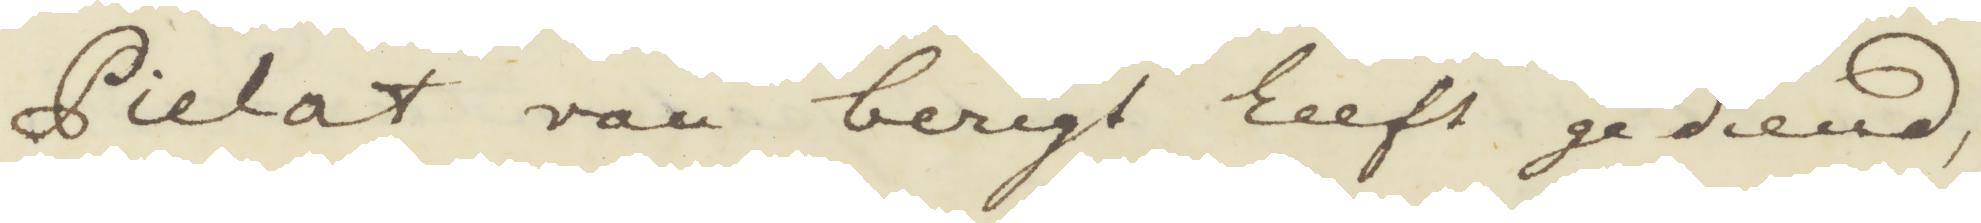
Pielat van berigt heeft gediend,
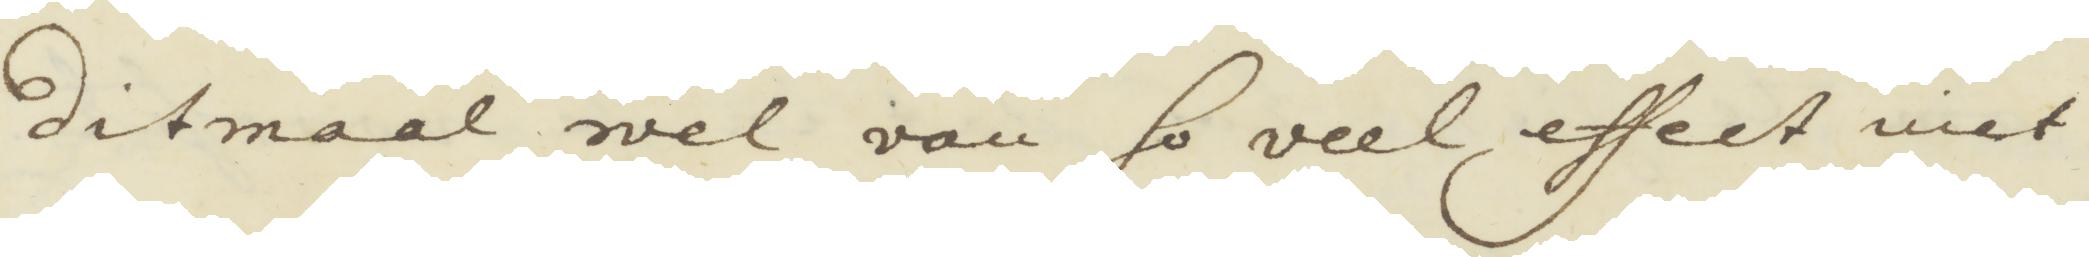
ditmaal wel van so veel effect niet
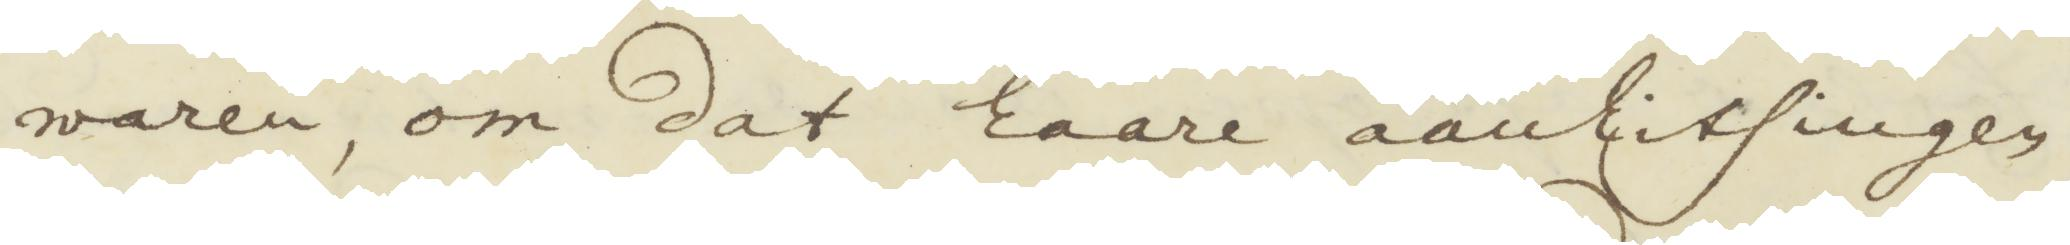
waren, om dat haare aanhitsingen
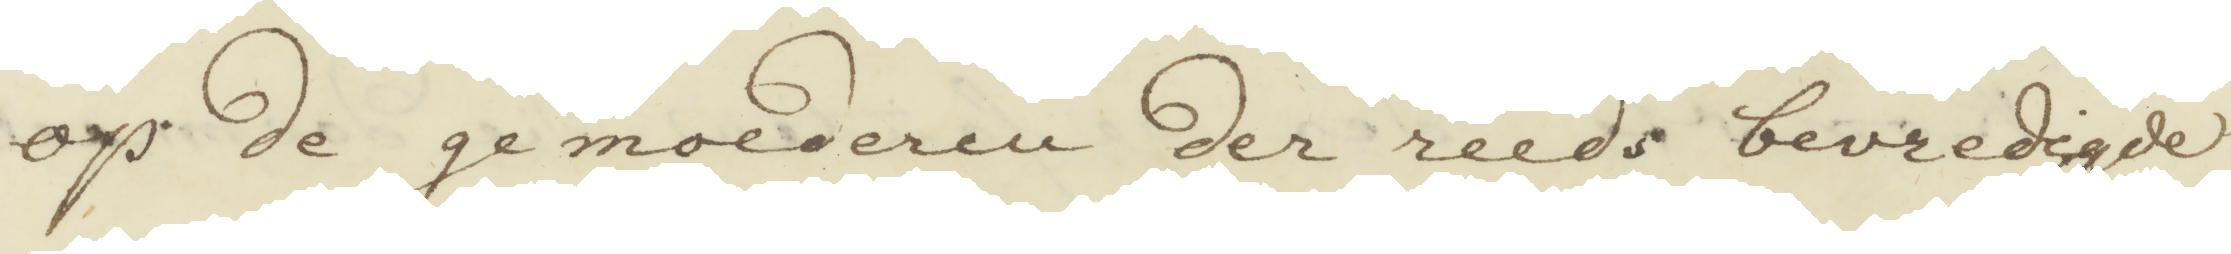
op de gemoederen der reeds bevredigde
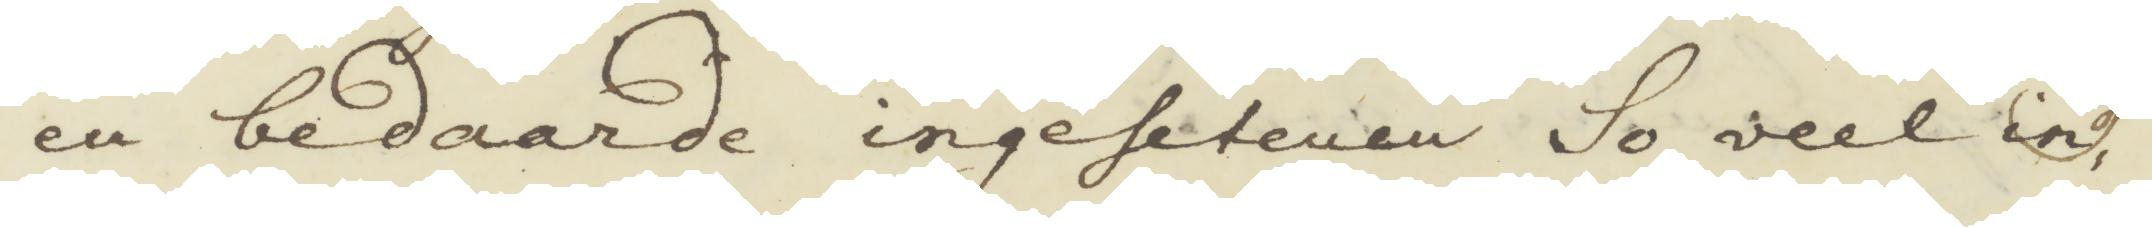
en bedaarde ingesetenen so veel in„
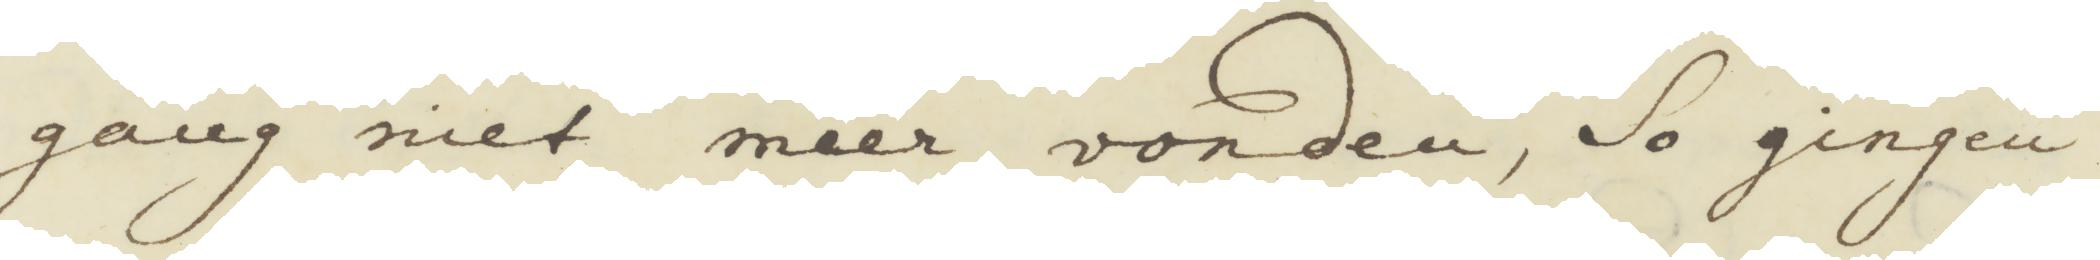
gang niet meer vonden, so gingen
